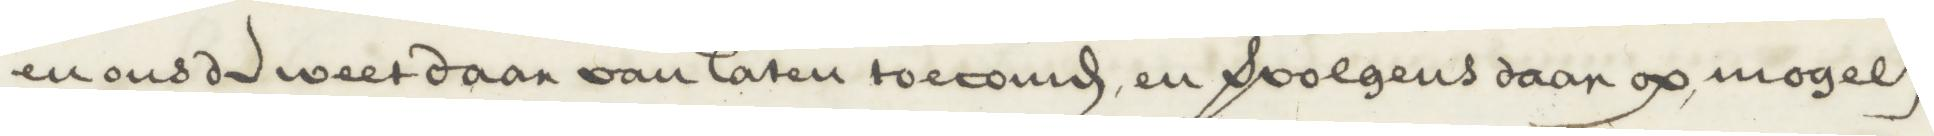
en ons de weet daar van laten toecomen, en vervolgens daar op, mogelijk
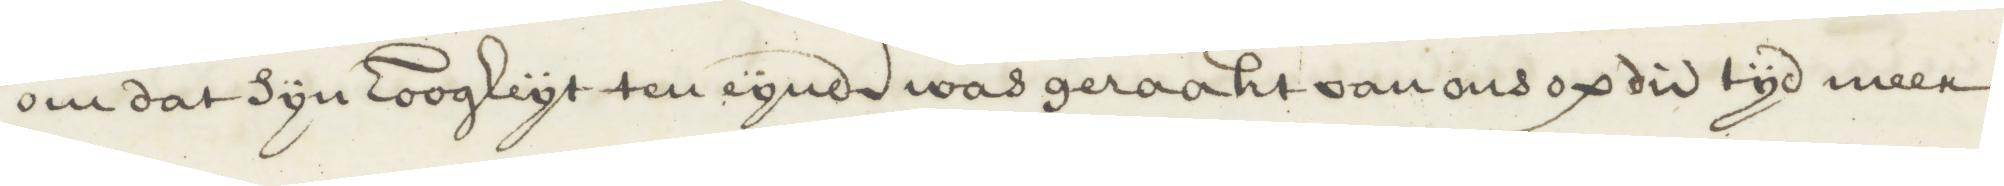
om dat sijn hoogheijt ten eijnde was geraakt van ons op die tijd meer
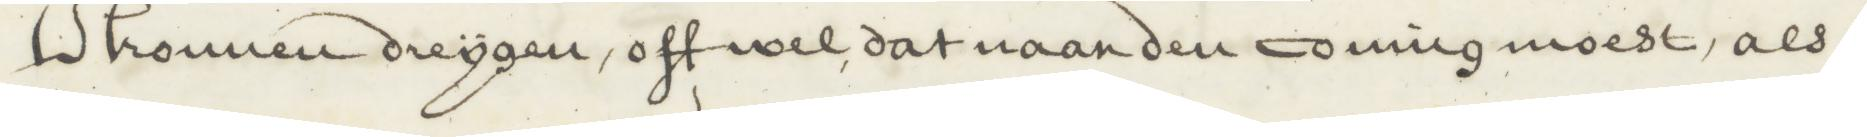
te konnen dreijgen, off wel, dat naar den coning moest, als
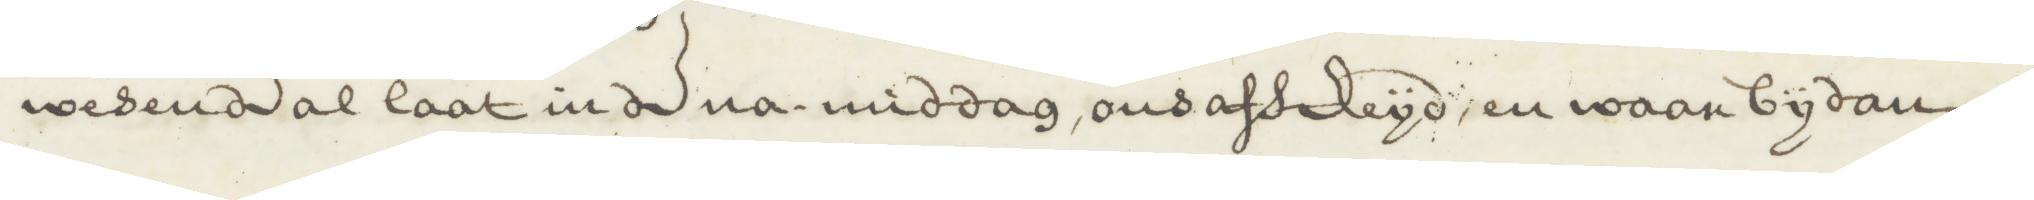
wesende al laat in de na-middag, ons afscheijd, en waar bij dan
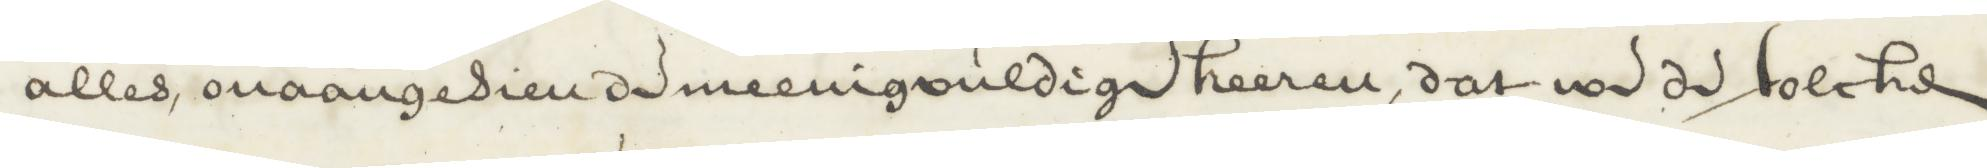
alles, onaangesiende meenigvuldige keeren, dat we de tolcken
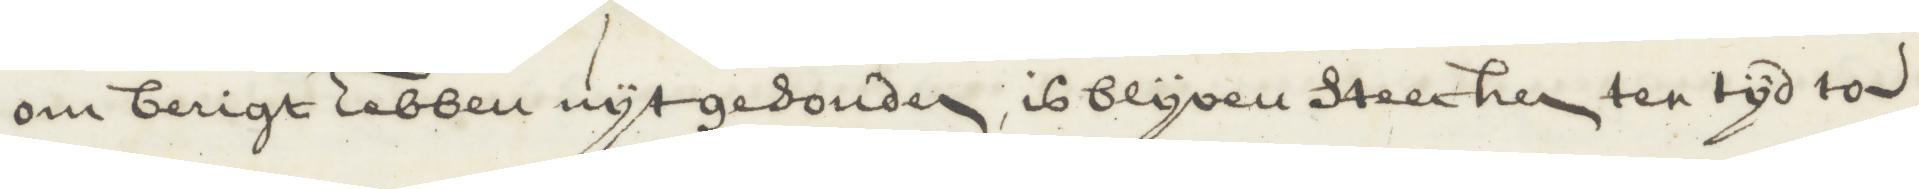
om berigt hebben uijtgesonden, is blijven steecken ter tijd toe,
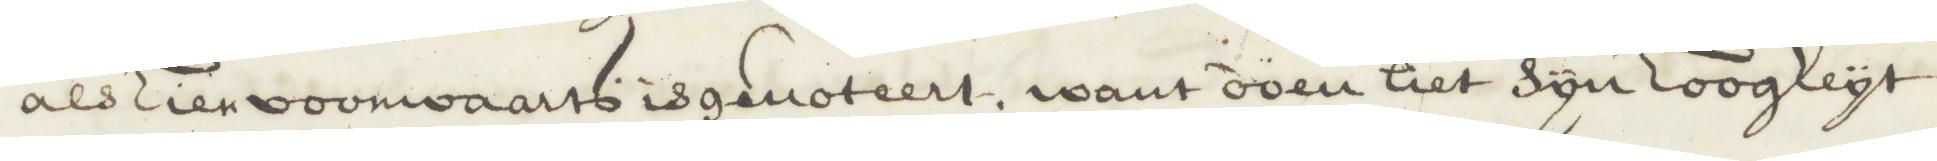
als hier voorwaarts is genoteert, want doen het sijn hoogheijt
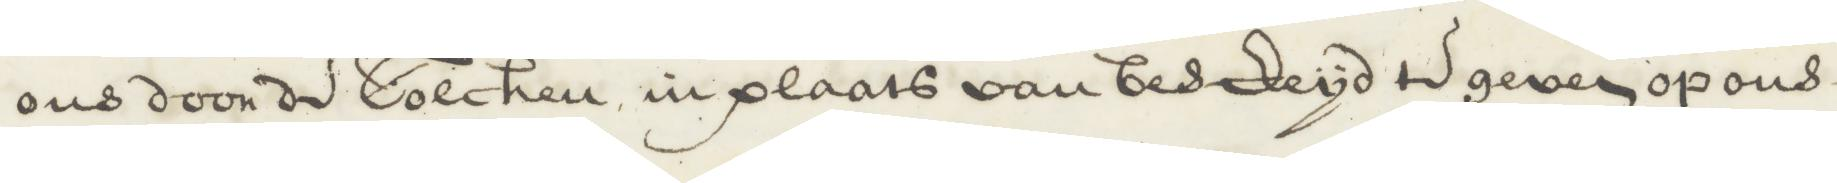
ons door de Tolcken, in plaats van bescheijd te geven op ons
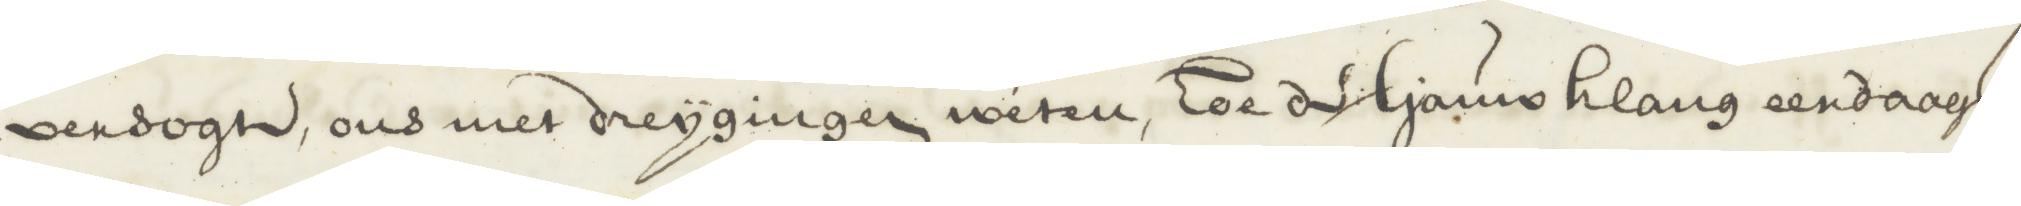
versogte, ons met dreijgingen weten, hoe de tjauw klang eerdaags
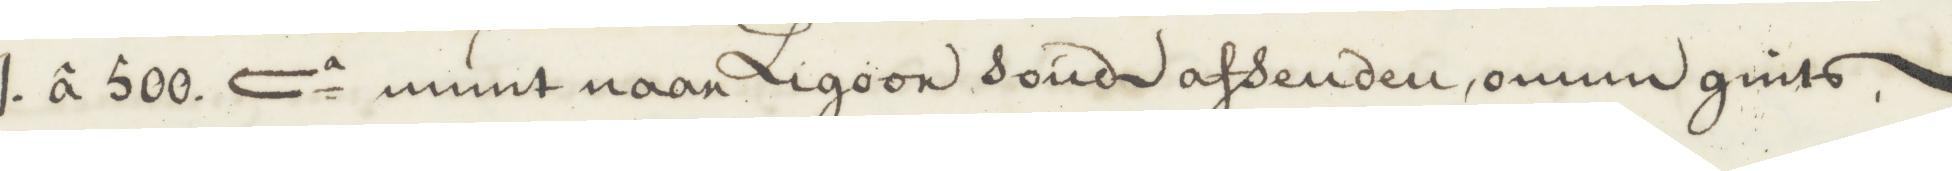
4. â 500. c=a munt naar Ligoor soude afsenden, omme gints,
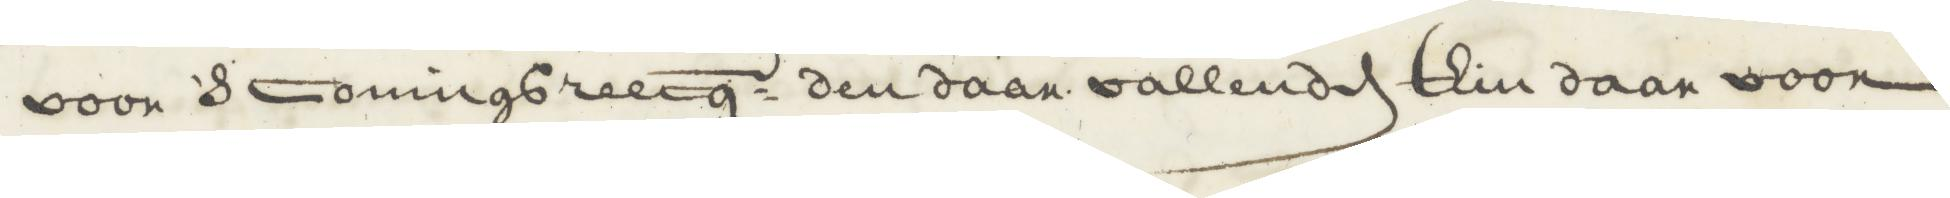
voor ’s conings reecq=e den daar vallende thin daar voor
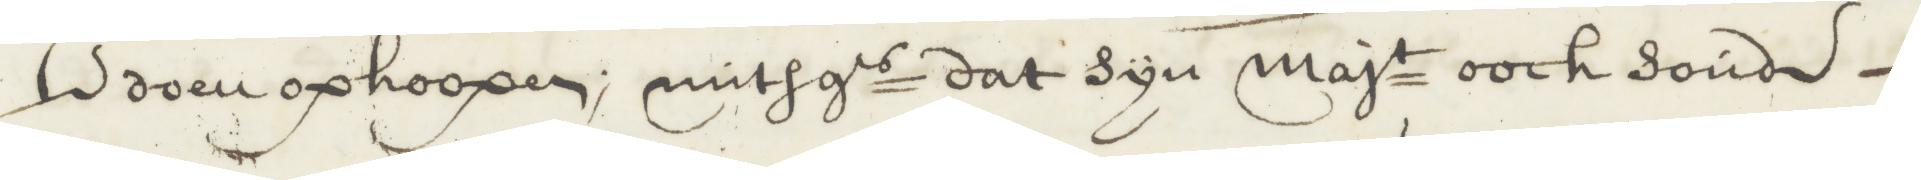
te doen opkoopen; mitsg=rs dat sijn maj=t oock soude
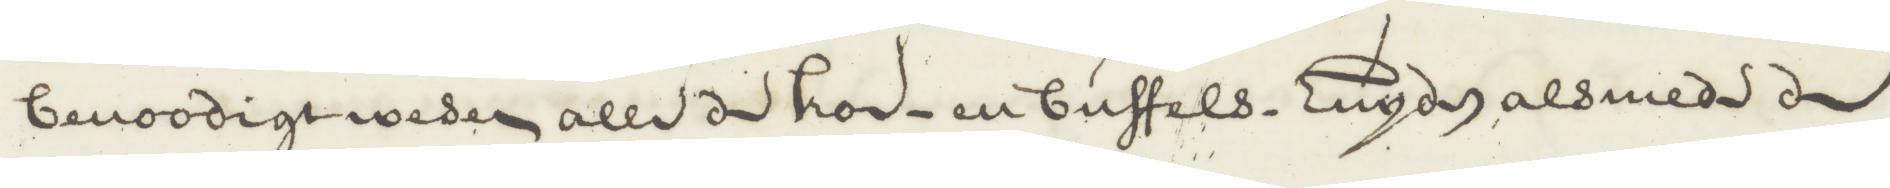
benoodigt wesen alle de koe- en buffels-huijden, als mede de
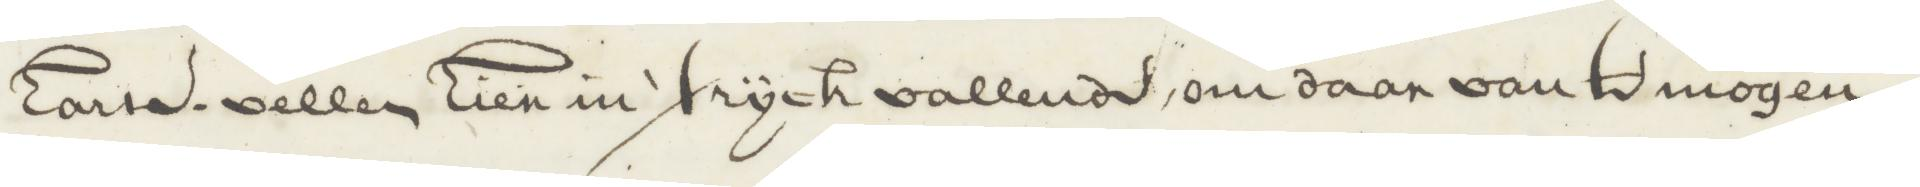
harte-vellen hier in 't rijck vallende, om daar van te mogen
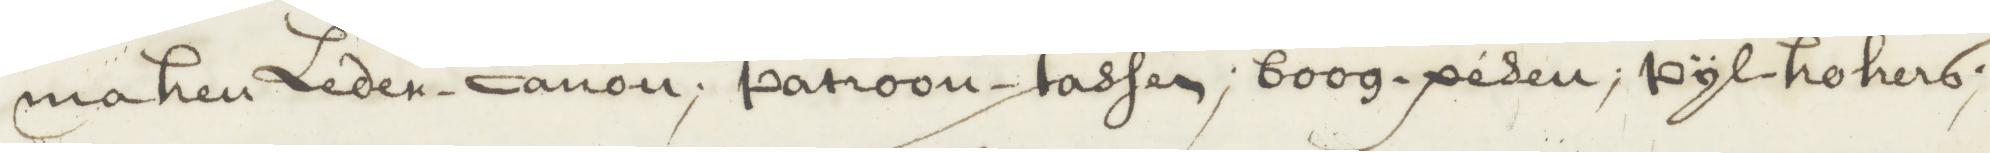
maken Leder-canon; patroon-tassen; boog-pesen; pijl-kokers;
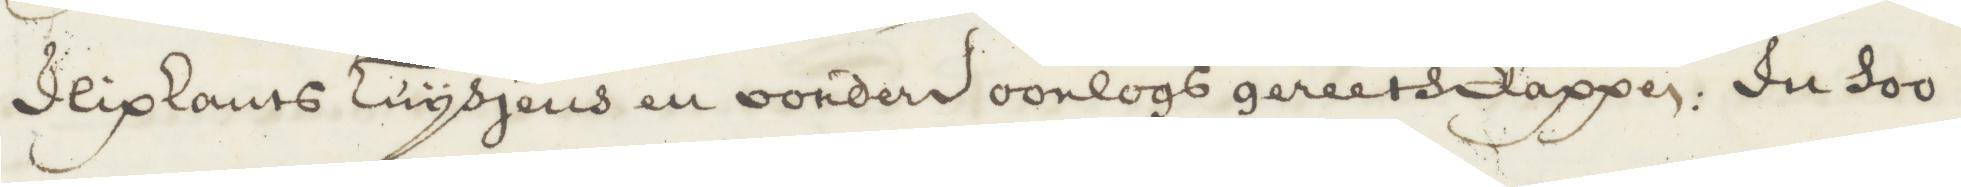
Eliphants huijsjens en vordere oorlogs gereetschappen: En soo
